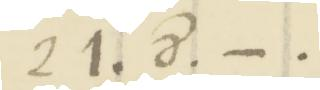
21. 8.—.
